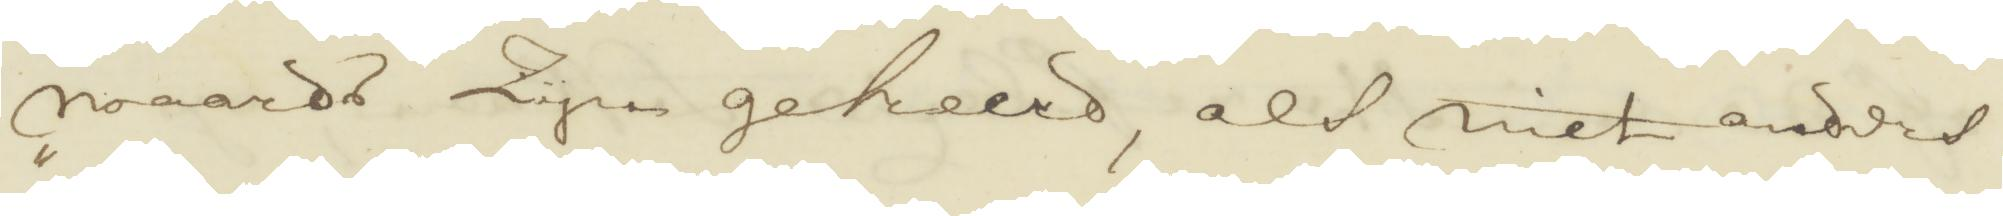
„waards zijn gekeerd, als niet anders
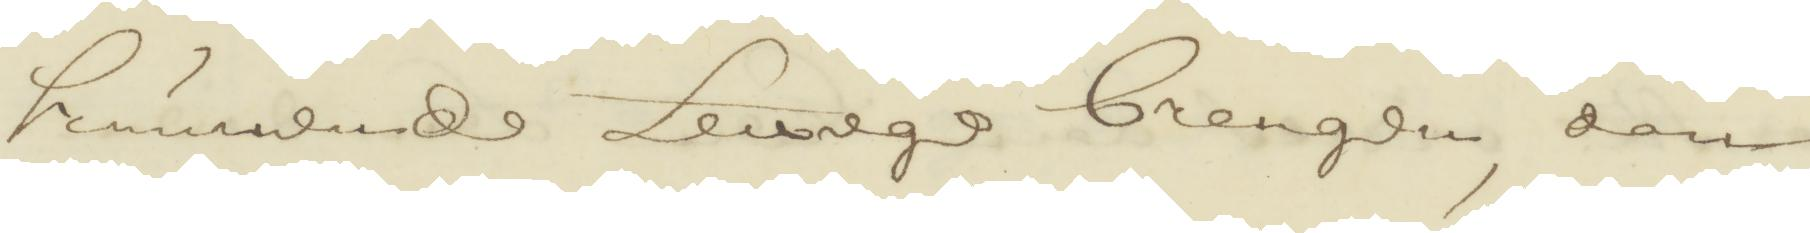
kunnen de tewege brengen, dan
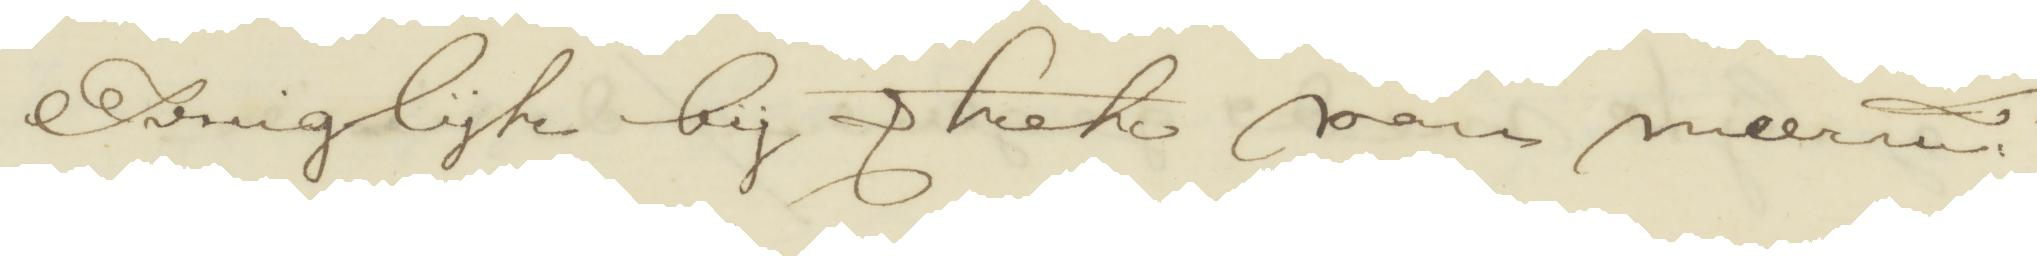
Eeniglijk bij vertrek van meerm:
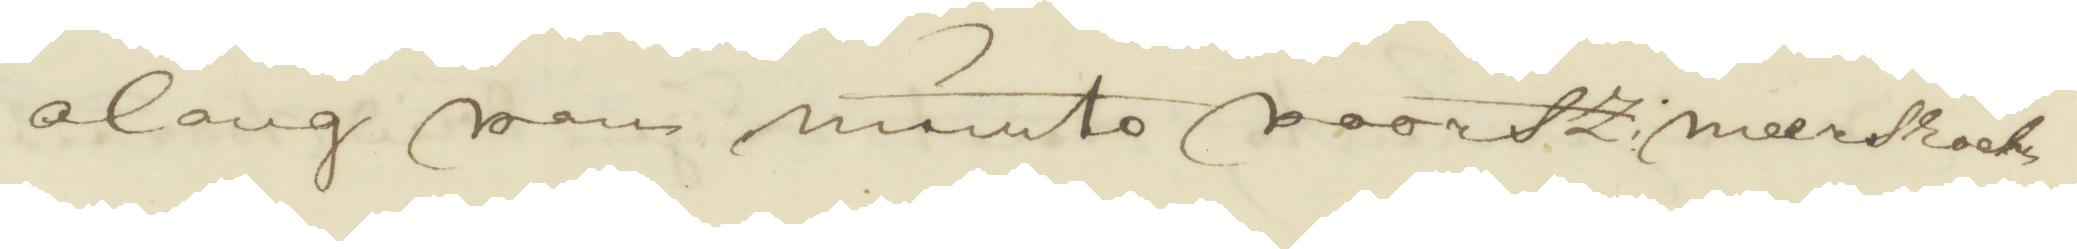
olang van munto voorsz: meershoek
